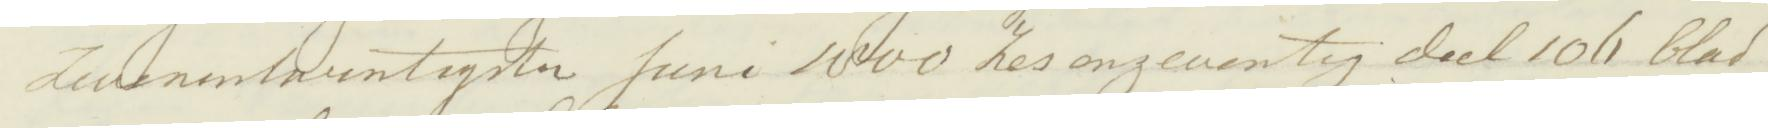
Zevenentwintigsten Juni 1800 zes enzeventig deel 106 blad
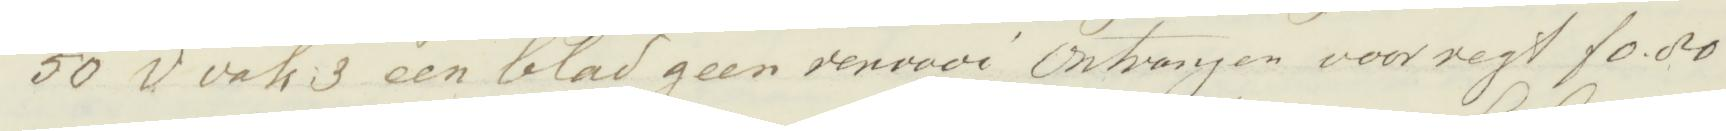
50 V vak: 3 een blad geen renvooi Ontvangen voor regt ƒ0. 80
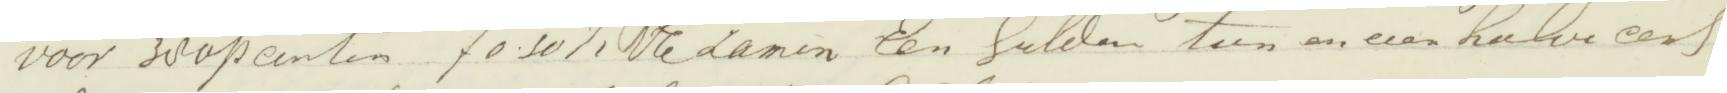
voor 38 opcenten ƒ0.30½: te zamen Een Gulden tien en een halve cent
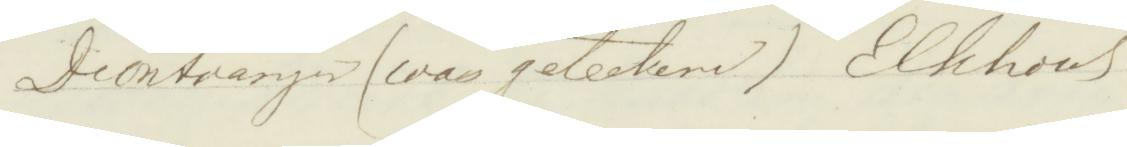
De ontvanger (was geteekend) Elkhout
